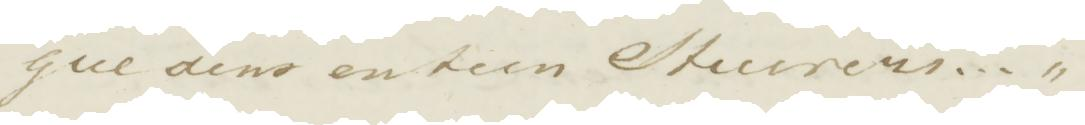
guldens en tien Stuivers - - - „
